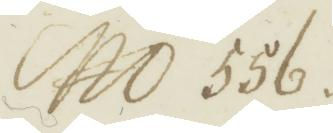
No 556.
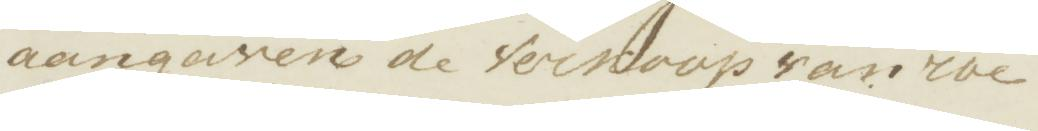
aangaven de verkoop van roe
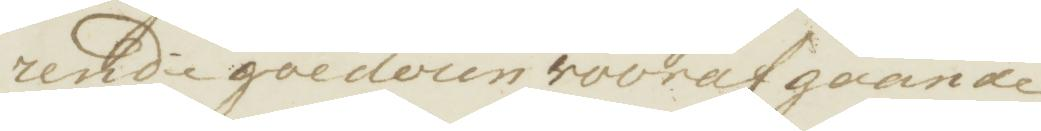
rende goederen voorafgaande
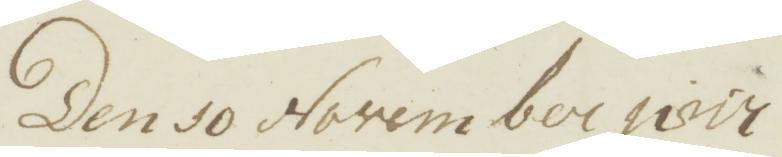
Den 10 November 1817
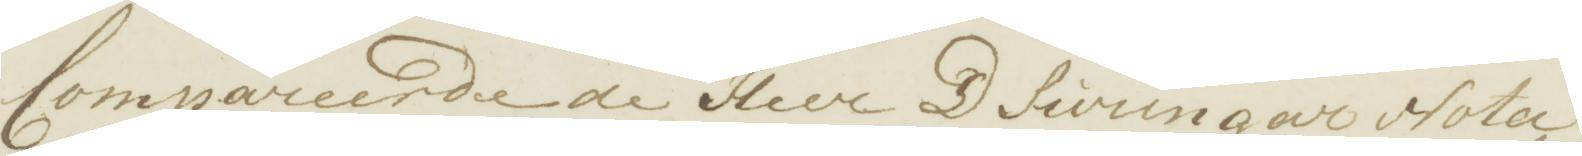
Compareerde de Heer D Suringar Nota
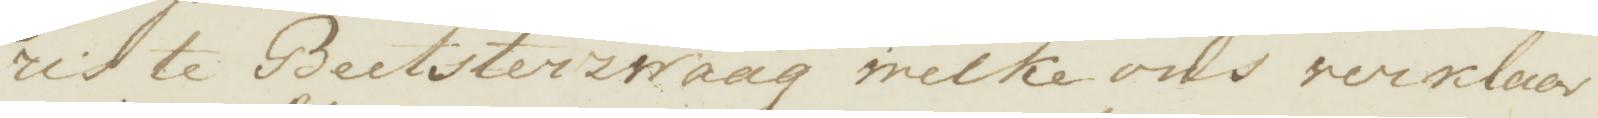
ris te Beetsterzwaag welke ons verklaar
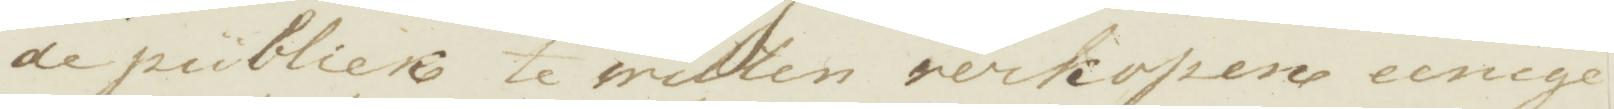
de publiek te willen verkopen eenige
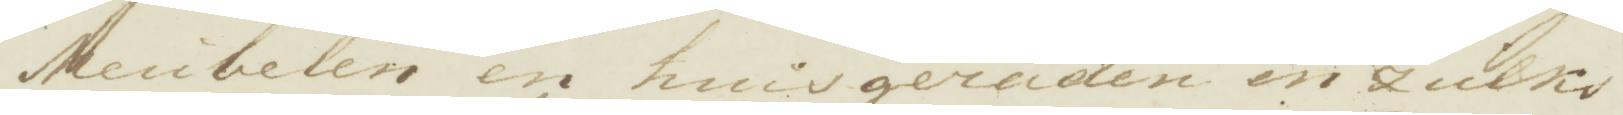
Meubelen en huisgeraden en zulks
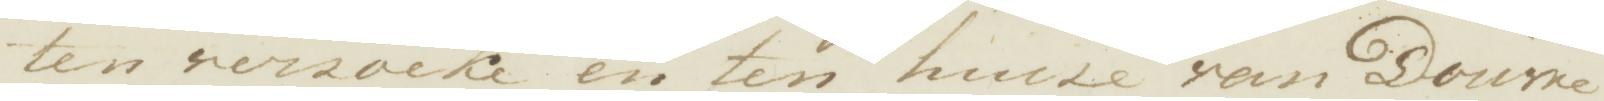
ten verzoeke en ten huize van Douwe
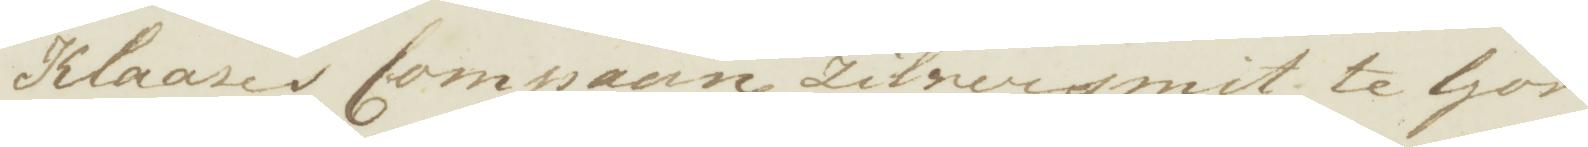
Klaases Compaan zilversmit te Gor
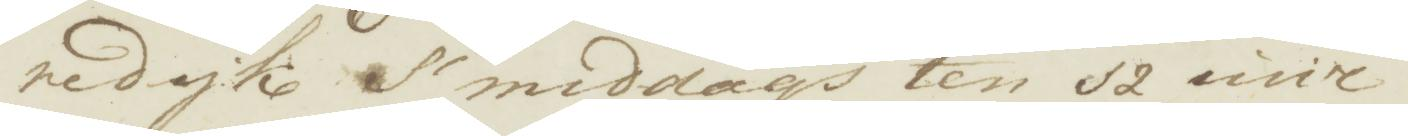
redijk s' middags ten 12 uur
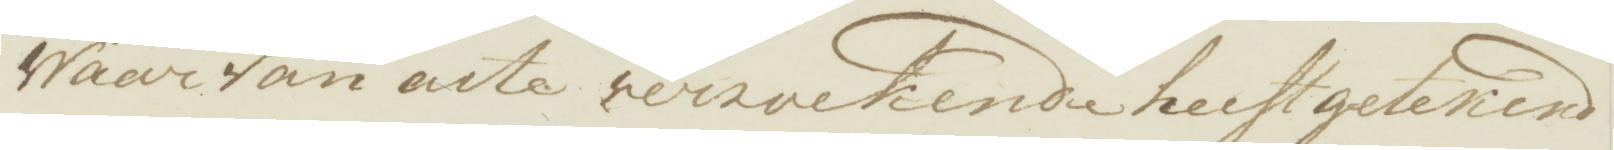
Waar van acte verzoekende heeft getekend
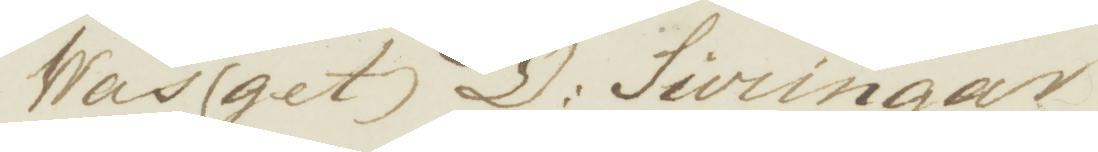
Was (get) D: Suringar
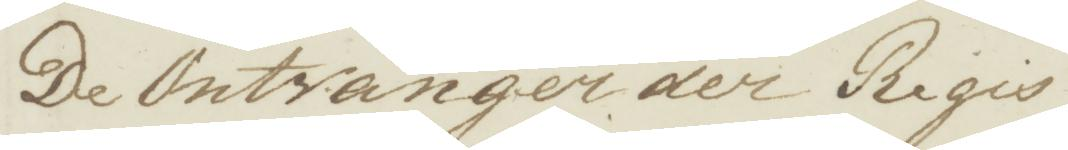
De Ontvanger der Regis
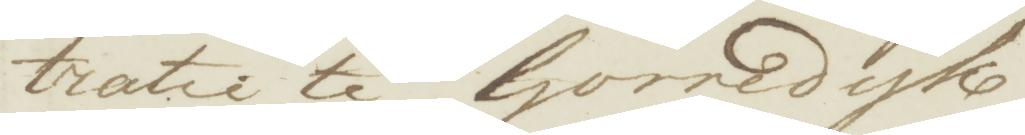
tratie te Gorredijk
